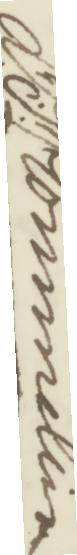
D.F.Crommelin
